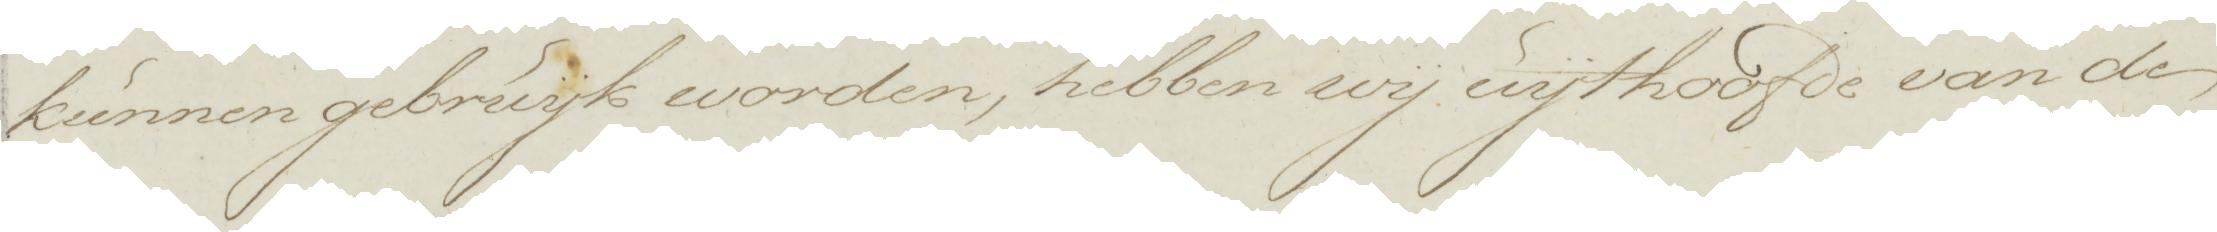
kunnen gebruijk worden, hebben wij uijthoofde van de
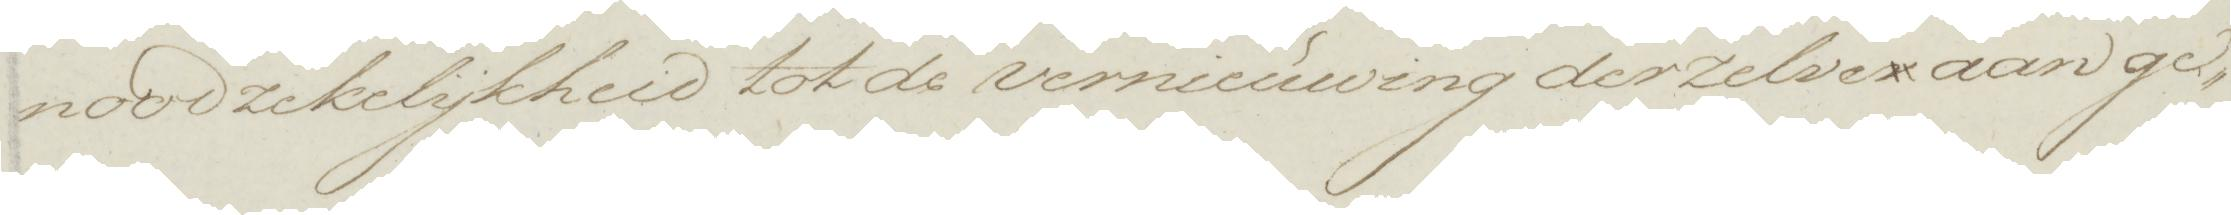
noodzekelijkheid tot de vernieuwing derzelver aan ge„
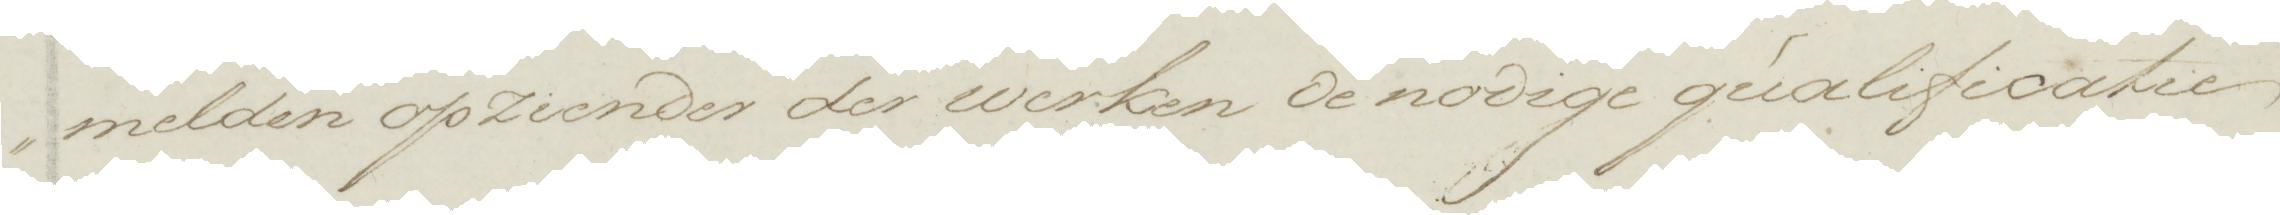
„melden opziender der werken de nodige qualificatie
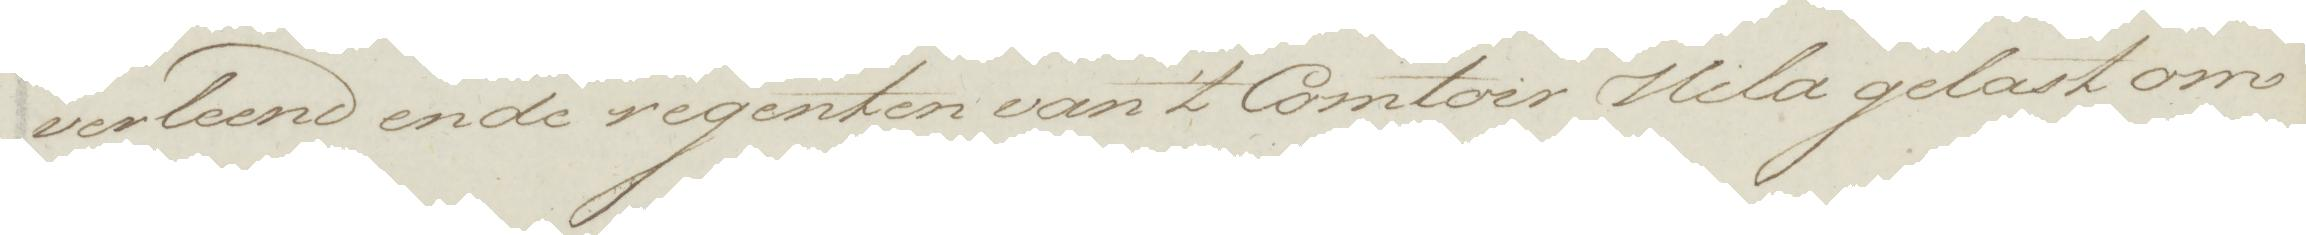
verleend ende regenten van ’t Comtoir Hila gelast om
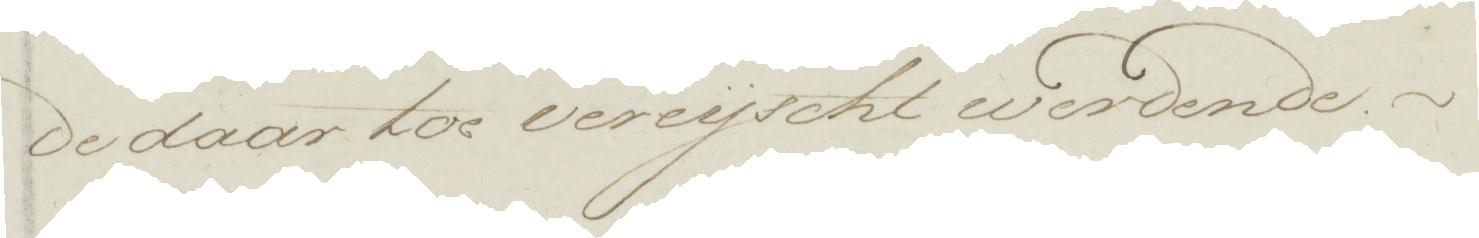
de daar toe vereijscht werdende—
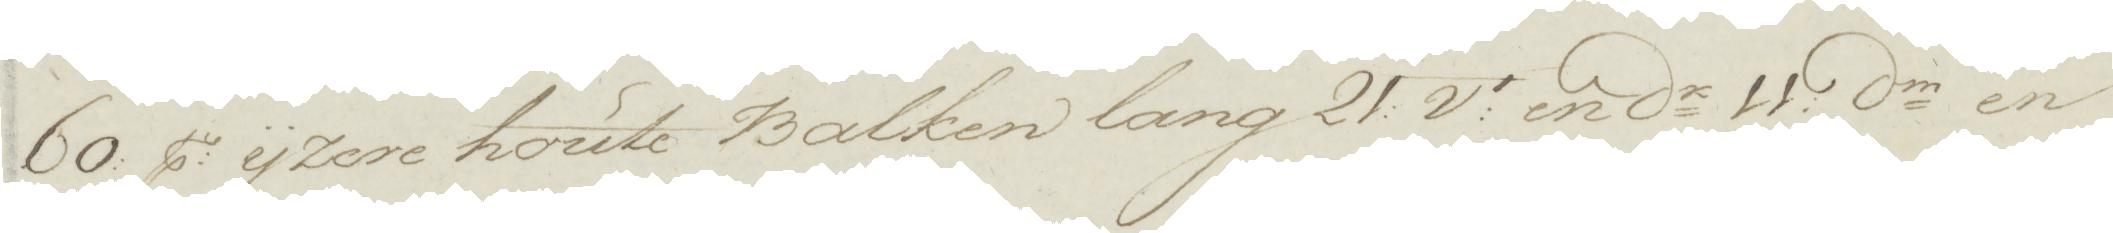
60: p:s ijzere houte Balken lang 21: v:t en d=k 11: d=m en
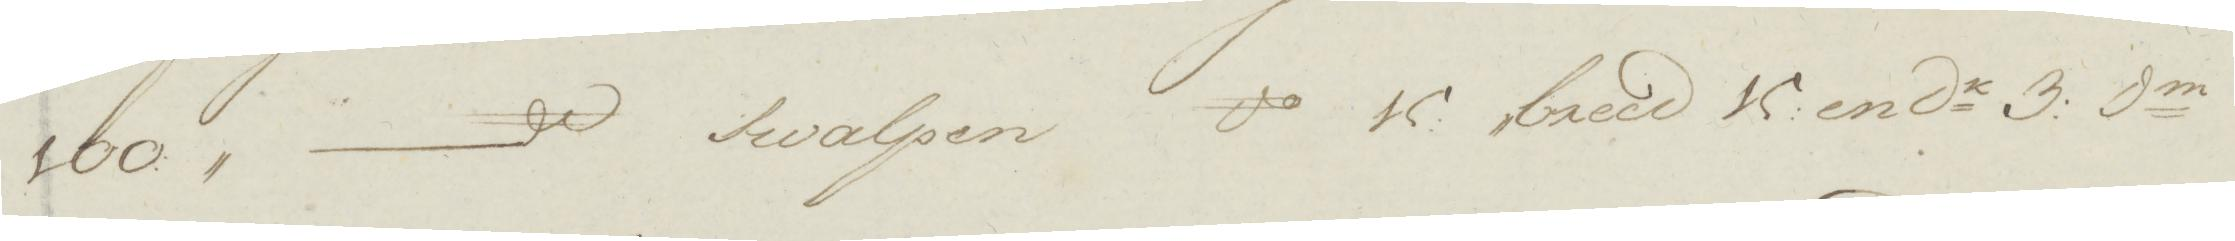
100: „ _=o swalpen d=o 15: breed 15: en d=k 3: d=m
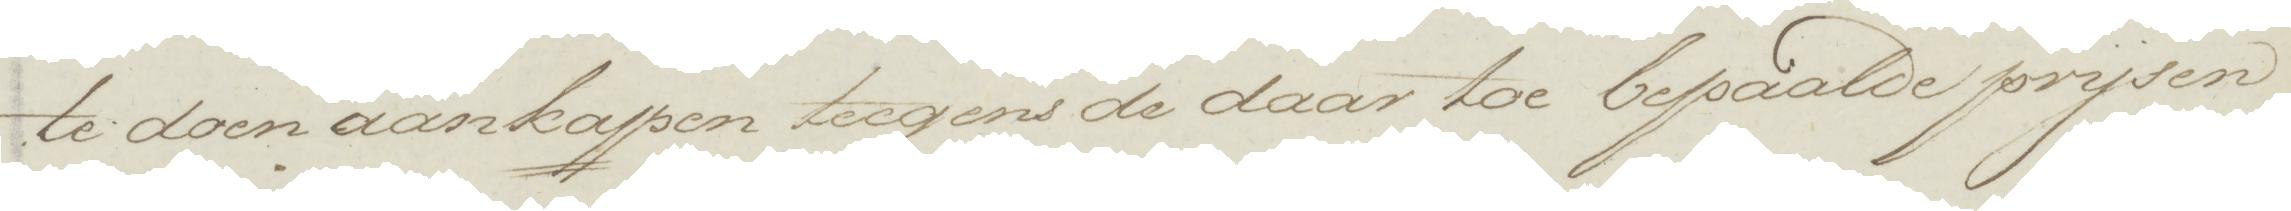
te doen aankappen teegens de daar toe bepaalde prijsen
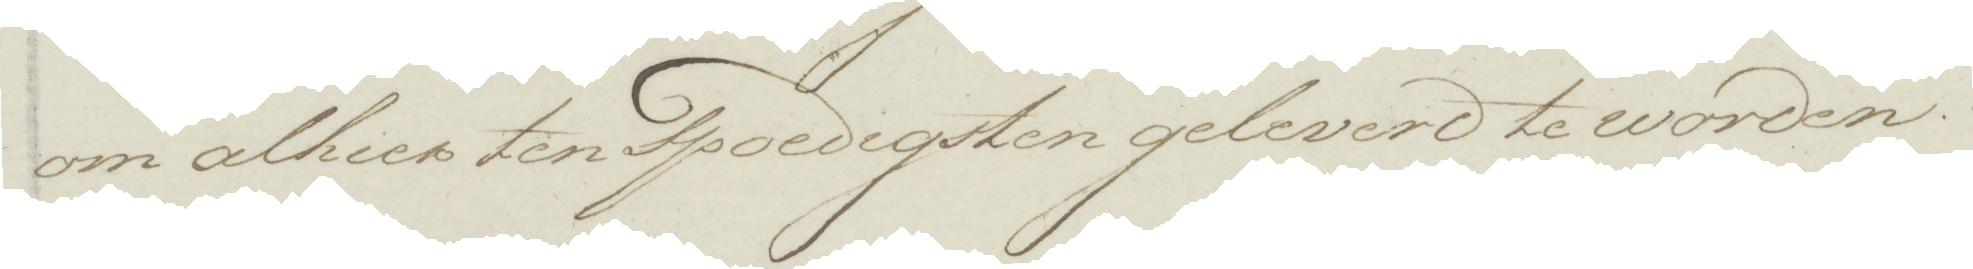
om alhier ten spoedigsten geleverd te worden.
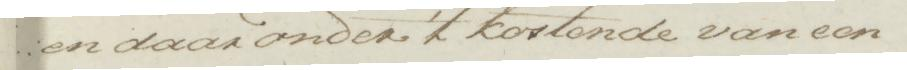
en daar onder ’t kostende van een
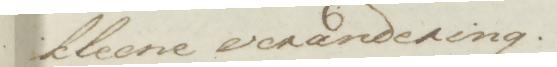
kleene verandering.
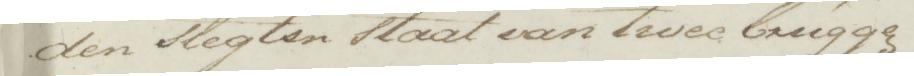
den slegten staat van twee bruggen
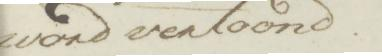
word vertoond.
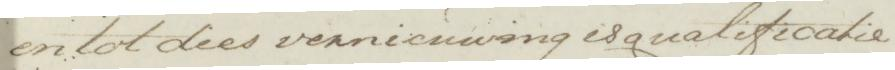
en tot dies vernieuwing is qualificatie
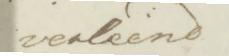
verleend
